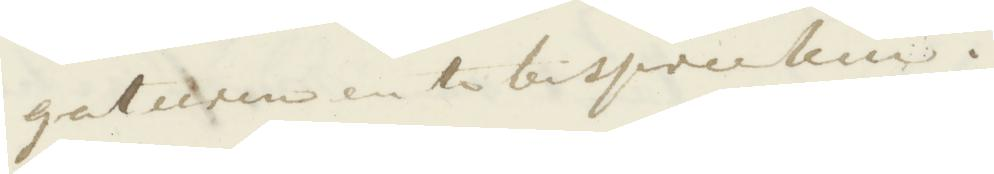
gateeren en te bespreeken.
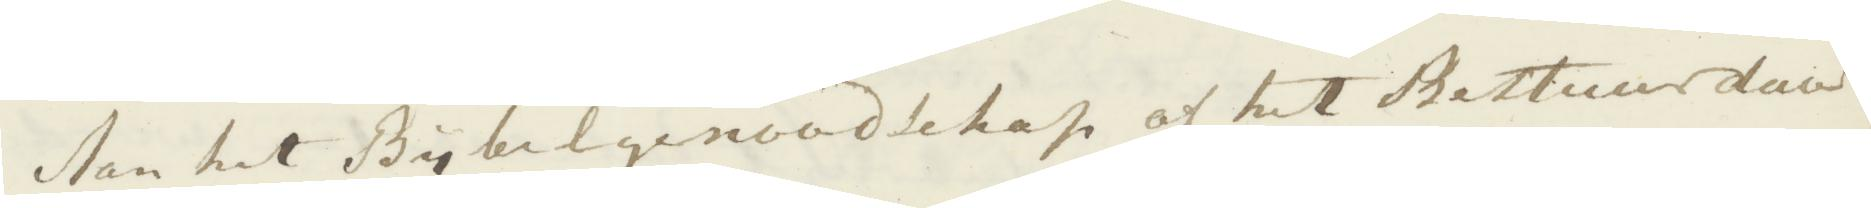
Aan het Bijbelgenoodschap of het Bestuur daar
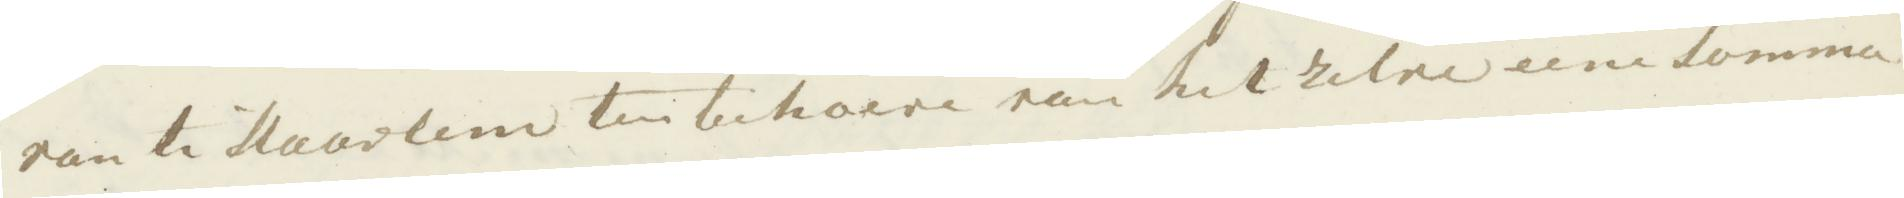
van te Haarlem ten behoeve van het zelve eene Somma
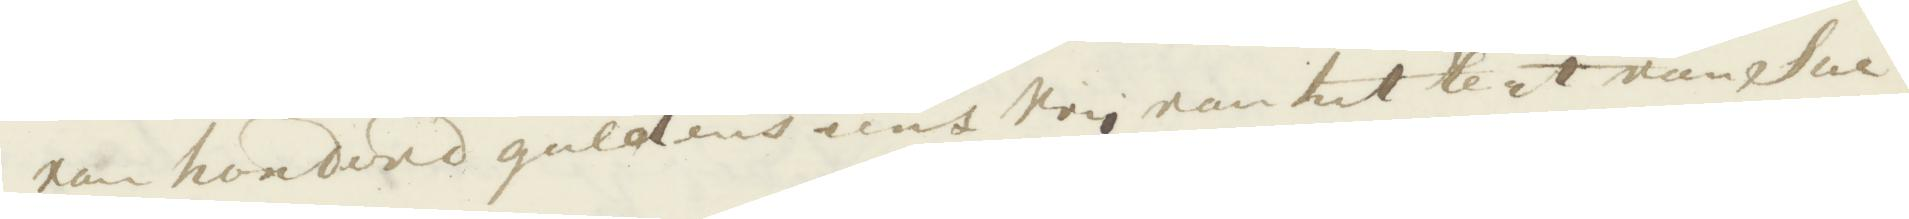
van honderd guldens eens Vrij van het Regt van Suc
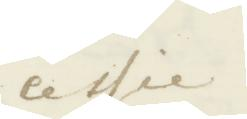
cessie
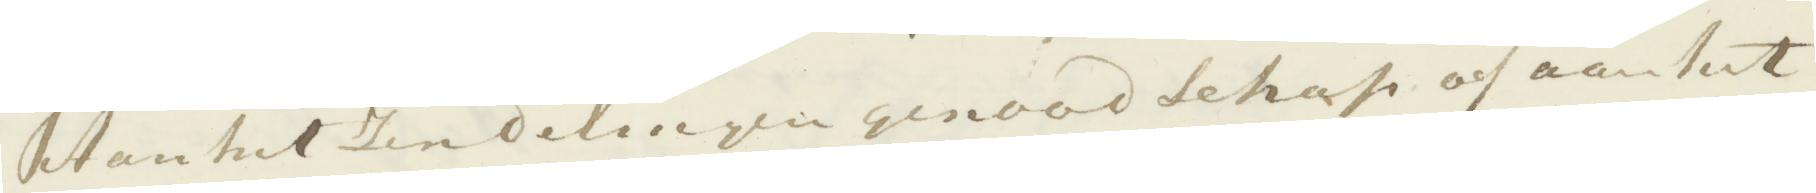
Aan het Zendelingen genoodschap of aan het
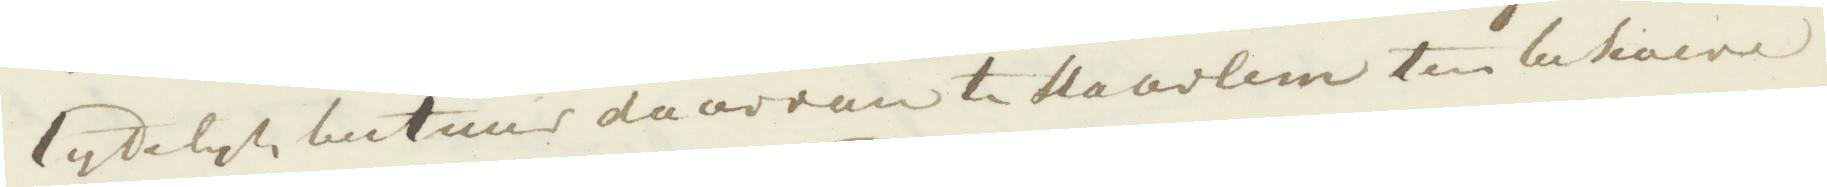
tijdelyk bestuur daarvan te Haarlem ten behoeve
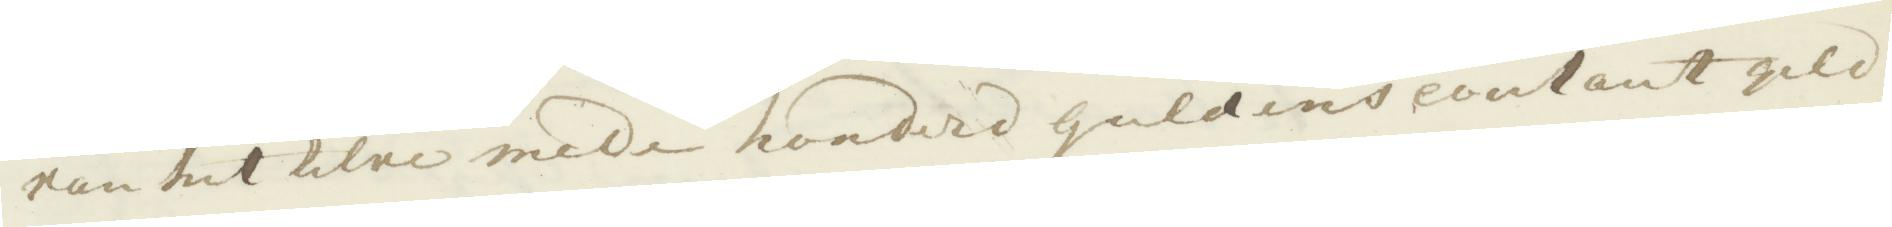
van het Zelve mede honderd guldens contant geld
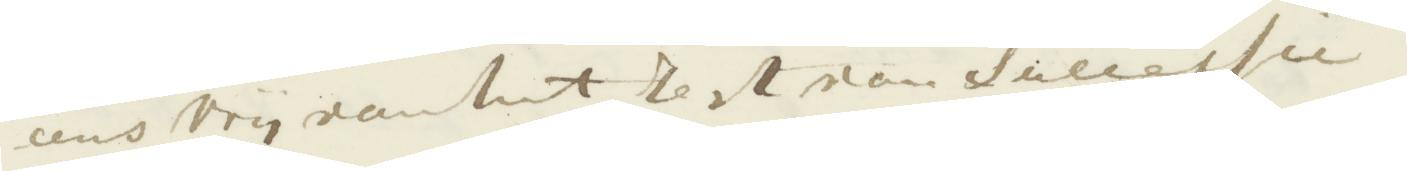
eens Vrij van het Regt van successie
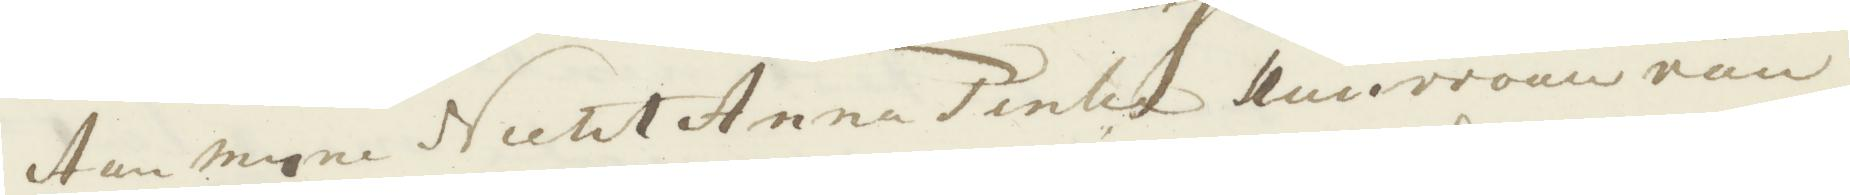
Aan myne Nicht Anna Pinke Huisvrouw van
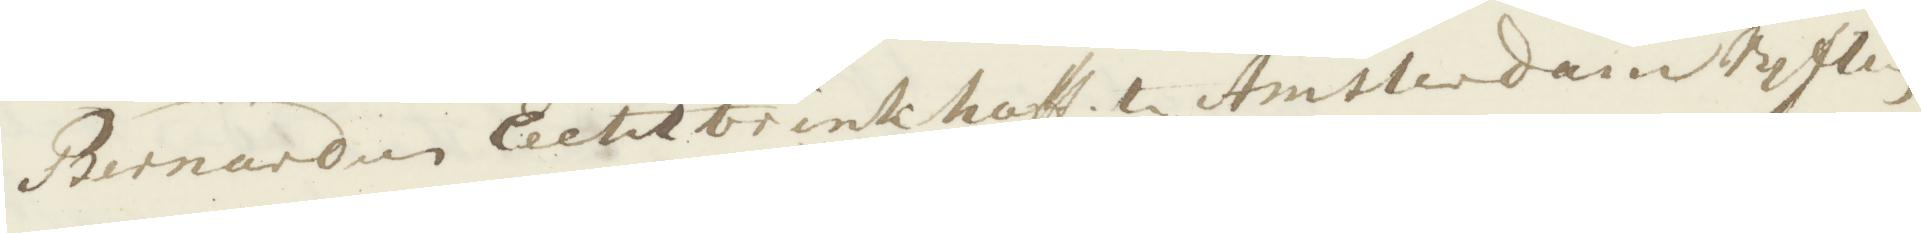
Bernardus Eechtbrinkhoff, te Amsterdam Vyftig
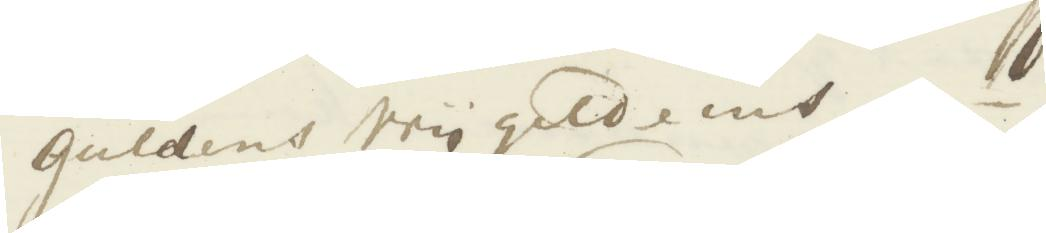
guldens Vrij geld eens
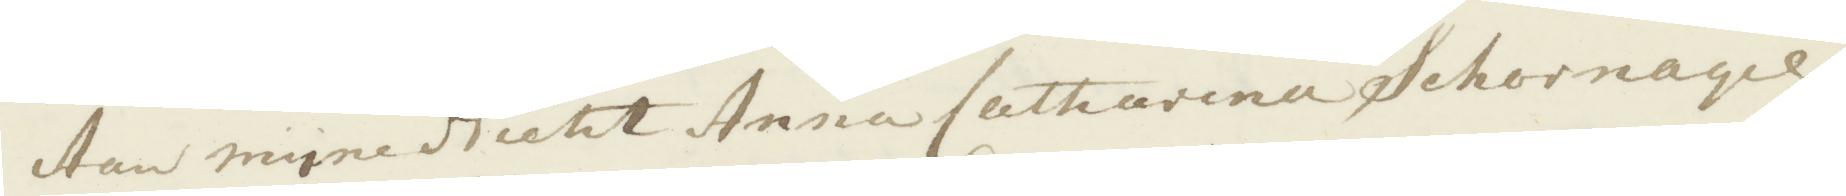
Aan mijne Nicht Anna Catharina Schornagel
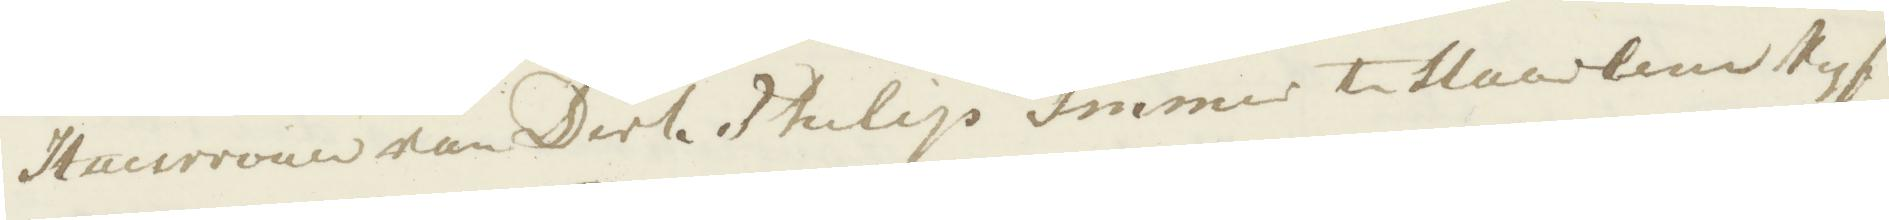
Huisvrouw van Derk Philip Immer te Haarlem vyf
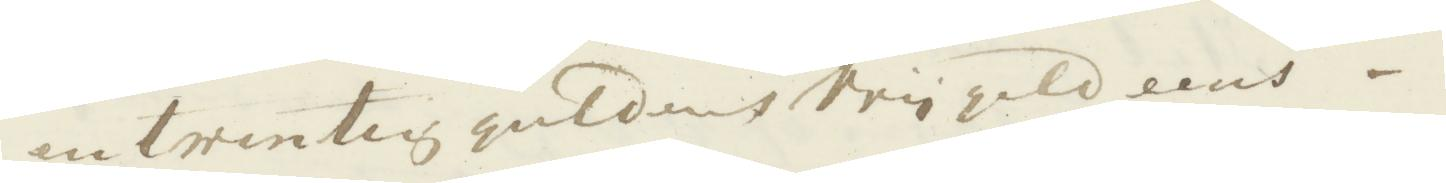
en twintig guldens vrij geld eens
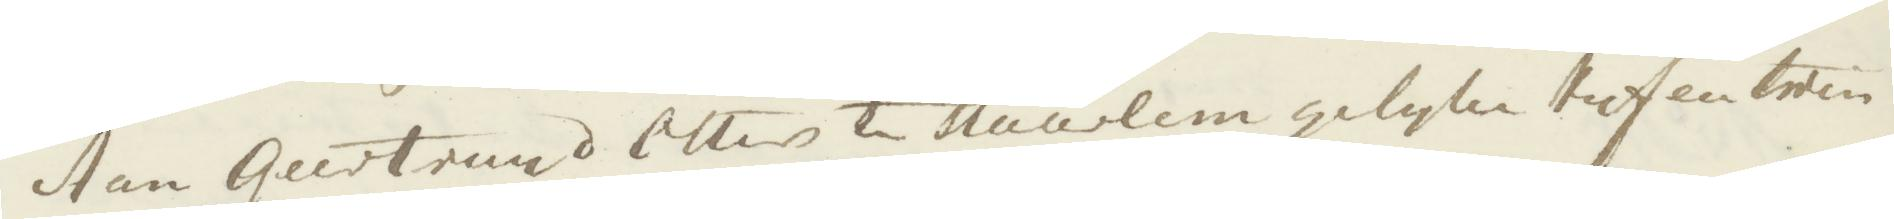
Aan Geertruyd Ottens te Haarlem gelyke vyf en twin
